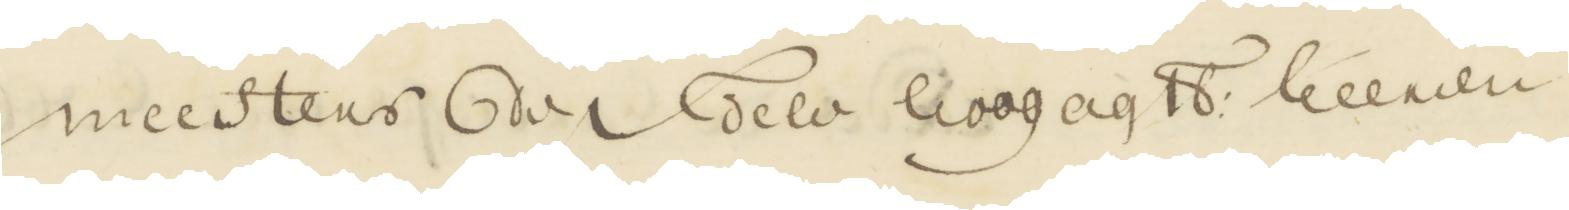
meesters de Edele hoog agtb: heeren
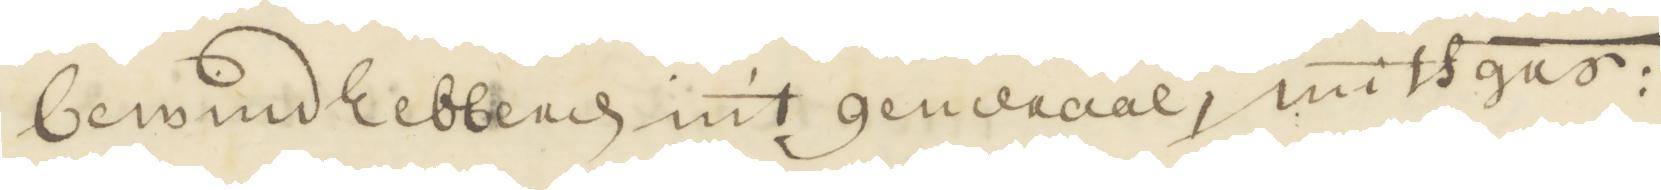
bewindhebberen in ’t geneeraal, mitsgrs:
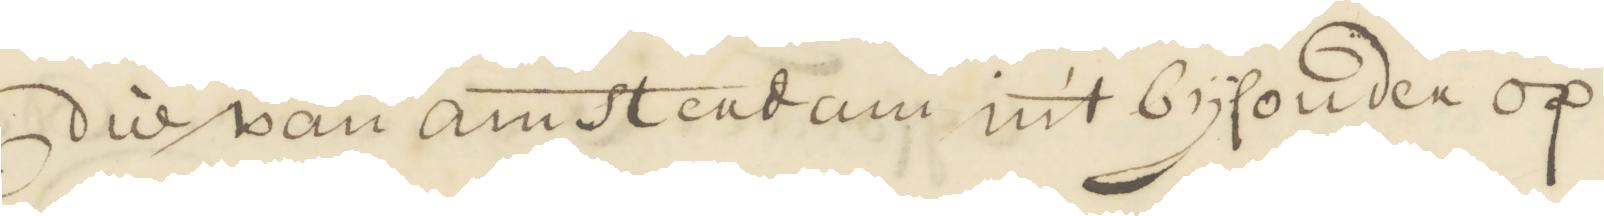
die van amsterdam in ’t bijsonder op
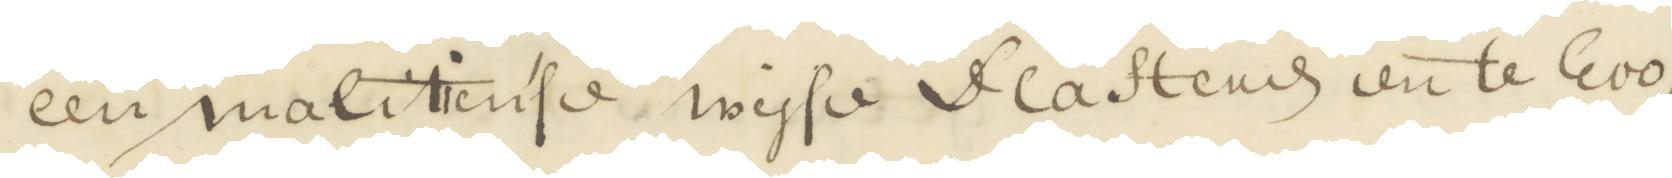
een malitieuse wijse blastenen en te hoo„
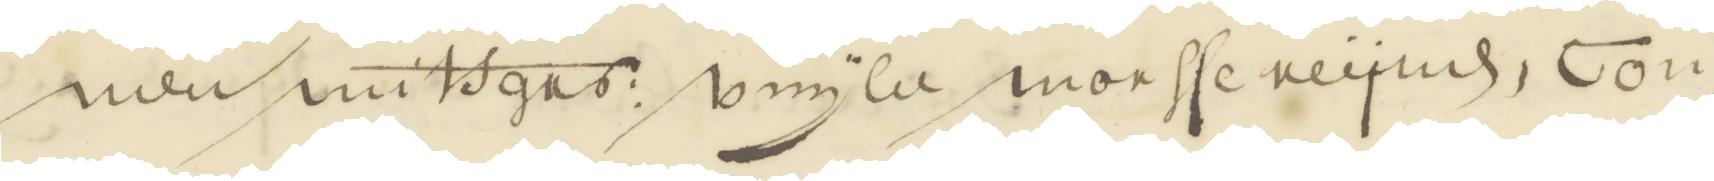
nen mitsgrs: vuijle morsse reijmen, con
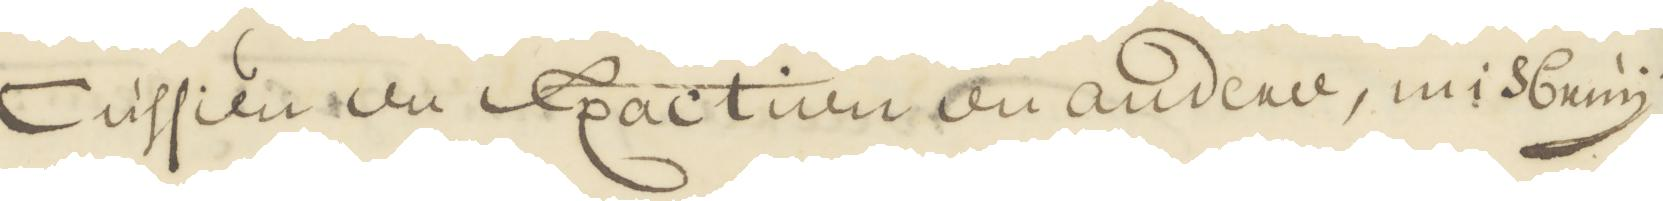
cussien en Exactien en andere, misbruij„
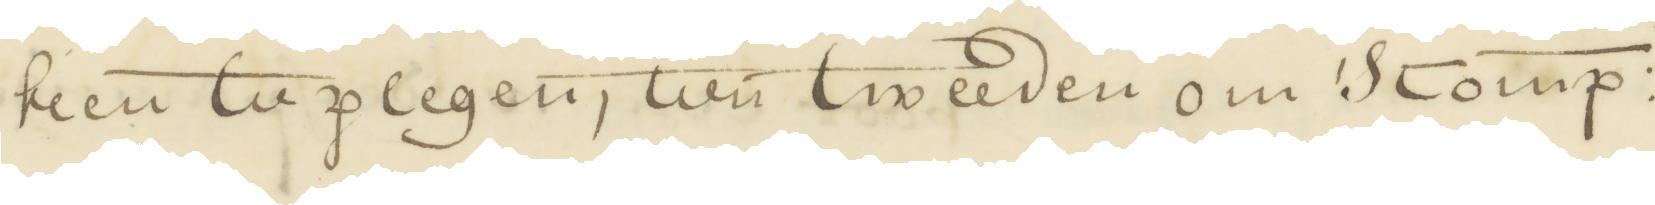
ken te plegen, ten tweeden om ’s comp:
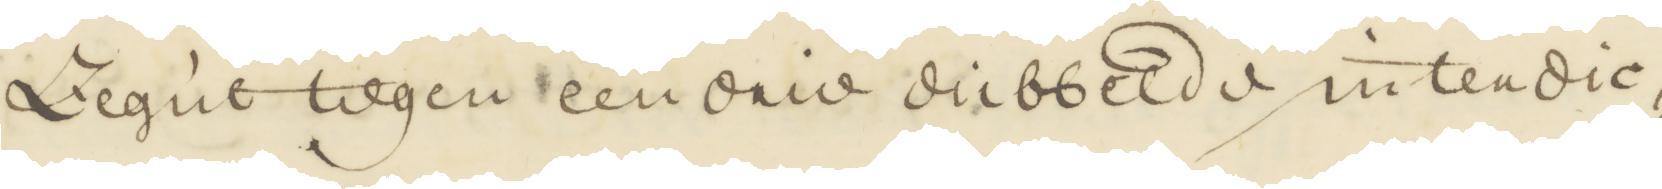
Zegul tegen een drie dubbelde interdic„
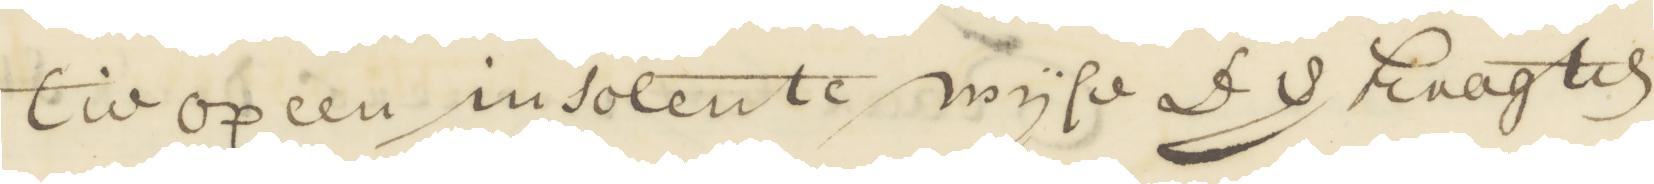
tie op een insolente wijse te verkragten
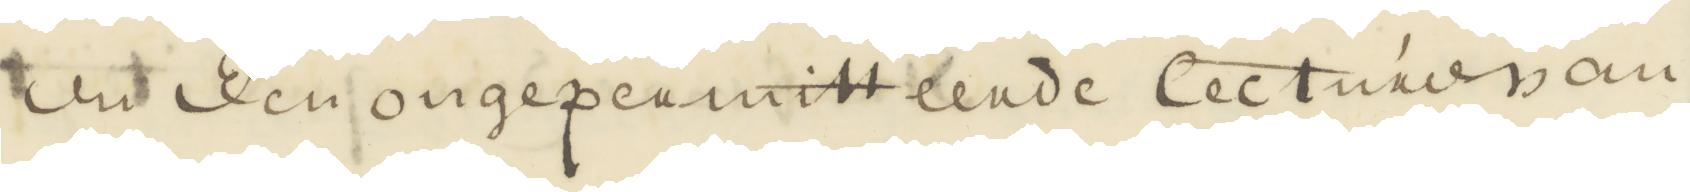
en Een ongepermitteerde lecture van
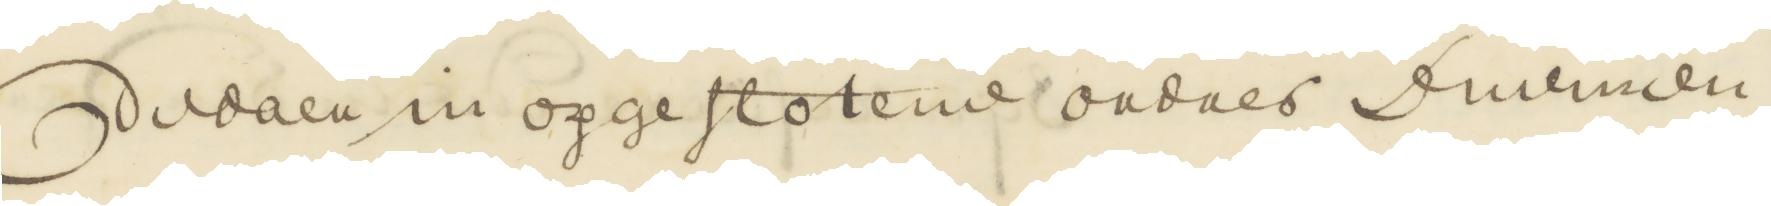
dedaer in opgeslotene ordres tenemen,
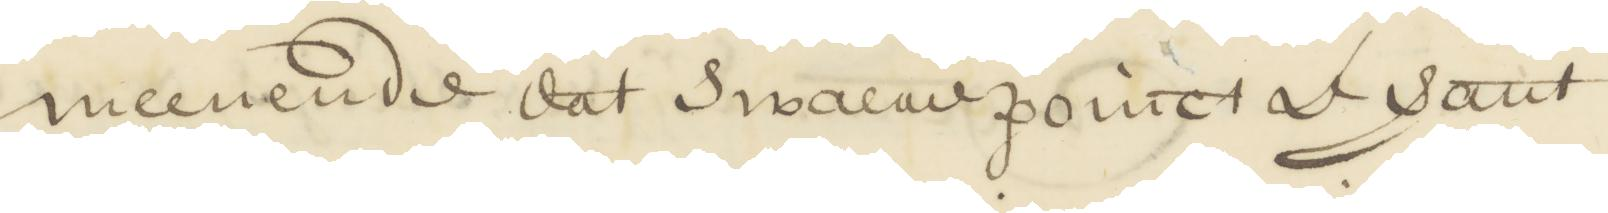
meenende dat swaere poinct te verant
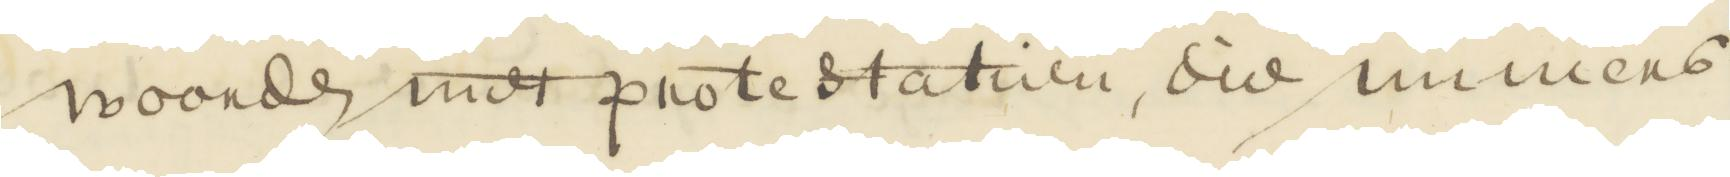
woorden met protestatien, die immers
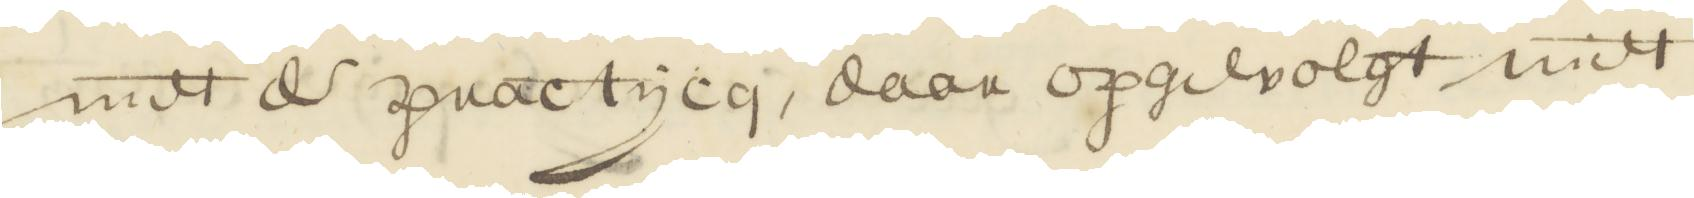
met de practijcq, daar opgevolgt niet
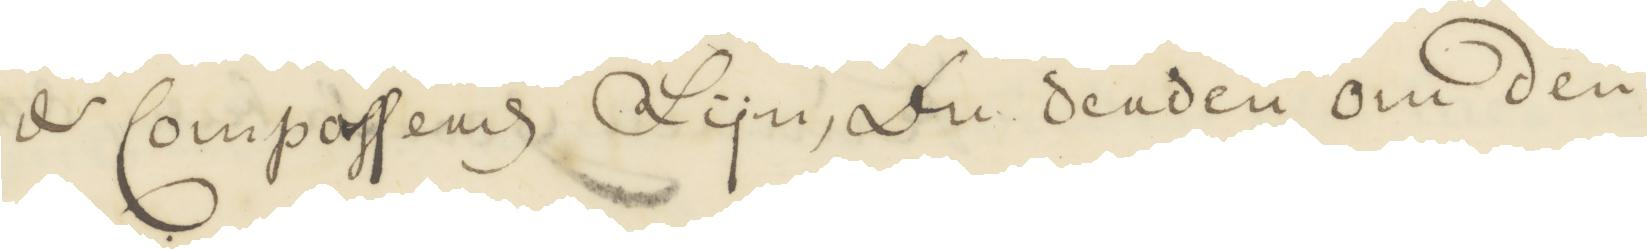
te Compasseren Sijn, ten derden om den
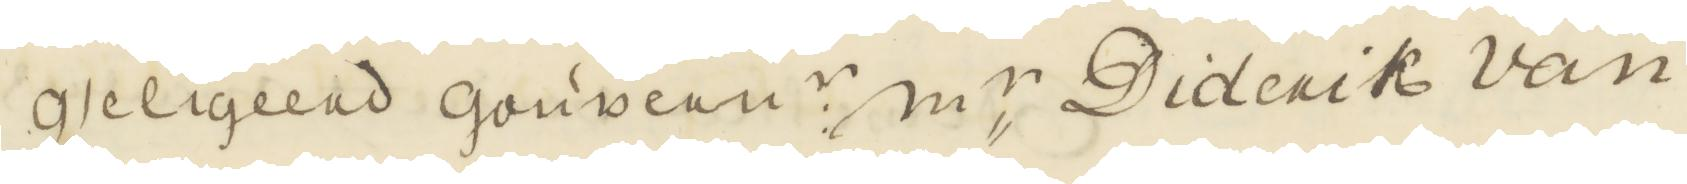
g'eligeerd gouvern:r m„r Diderik van
